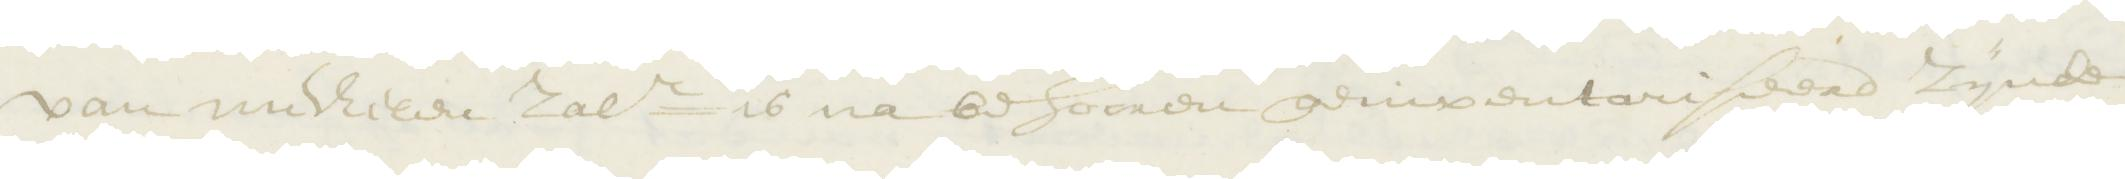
van methelen Zal=r is na behooren geinventariseerd Zijnde
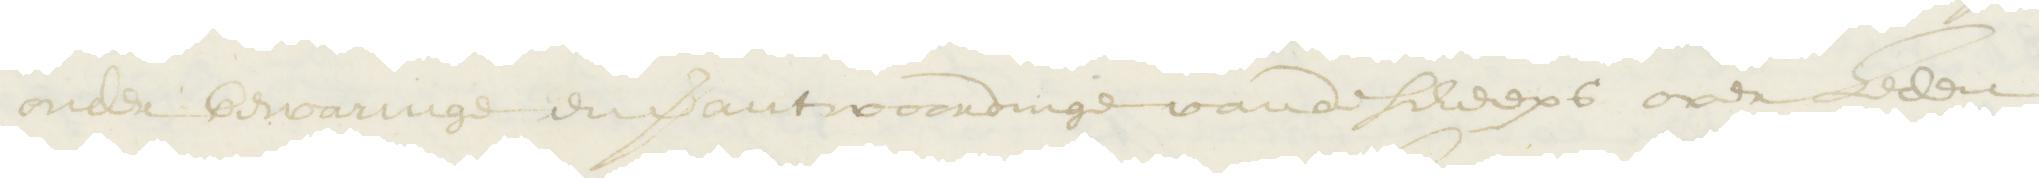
onder bewaringe en verantwoordinge van de scheeps over heden
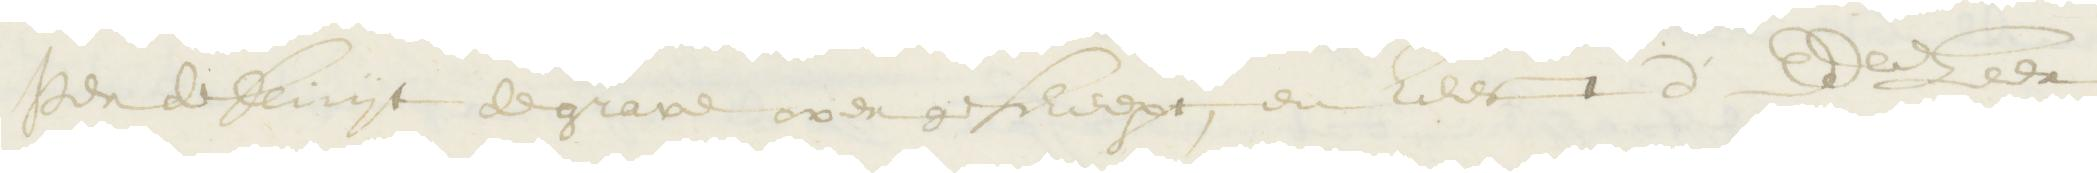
per defluijt degrave over gescheept, en heeft d’ Ed=le heer
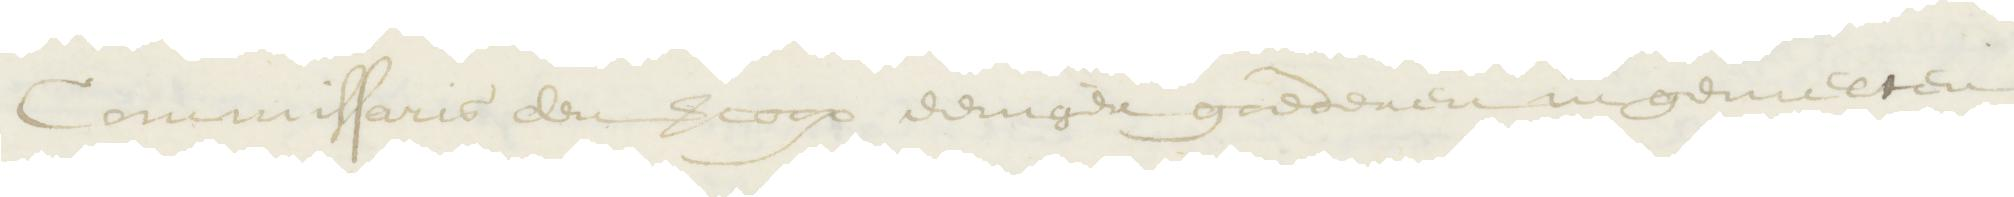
Commissaris den vercoop eeniger goederen in gemelten
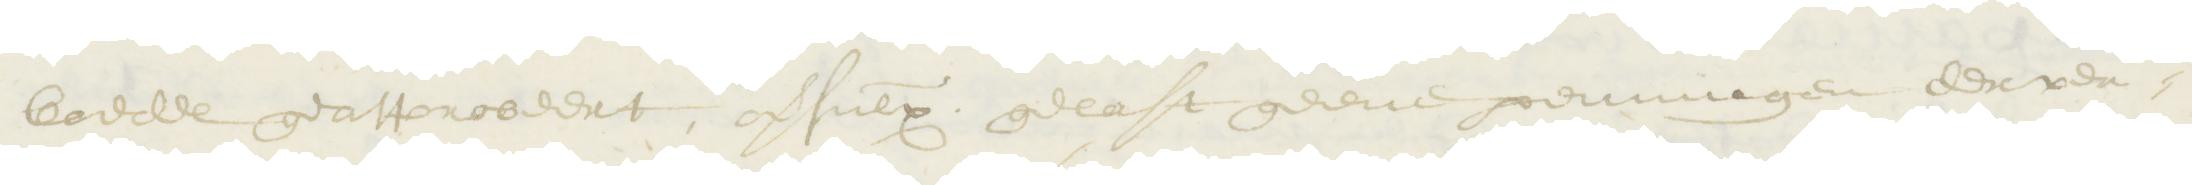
boedel geapprobeert, oversulx gelast geene penningen derver„
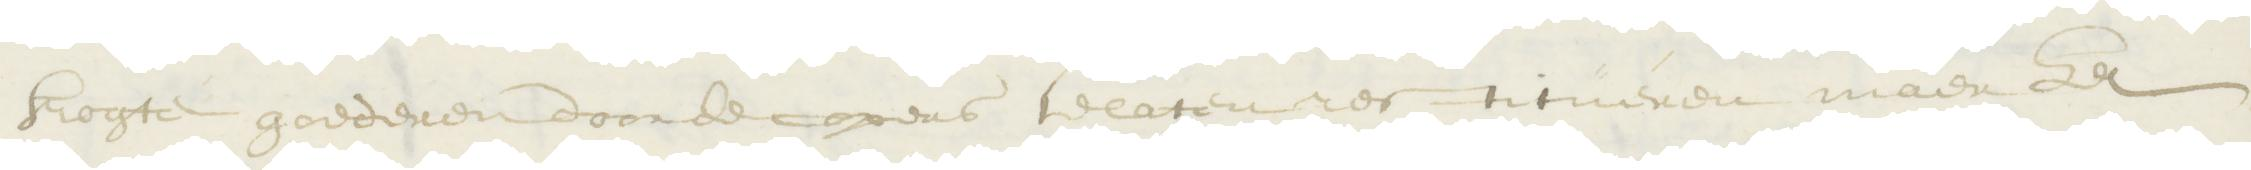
kogte goederen door de copers telaten restitueren, maer het
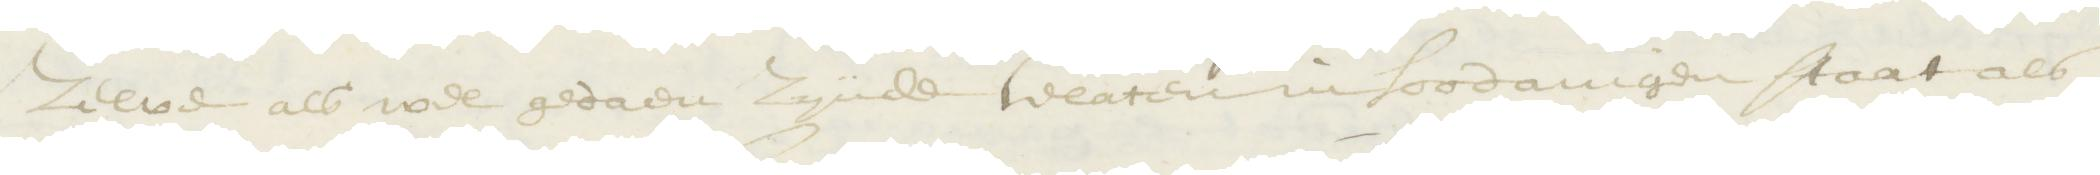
zelve als wel gedaen Zijnde telaten in Soodanigen staat als
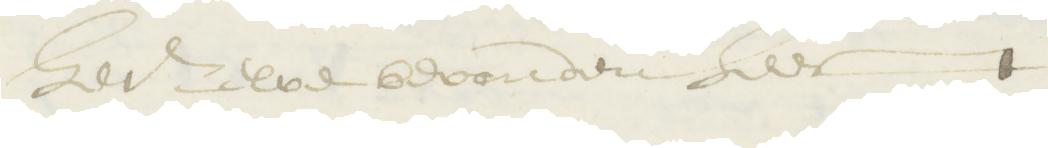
het zelve bevonden heeft
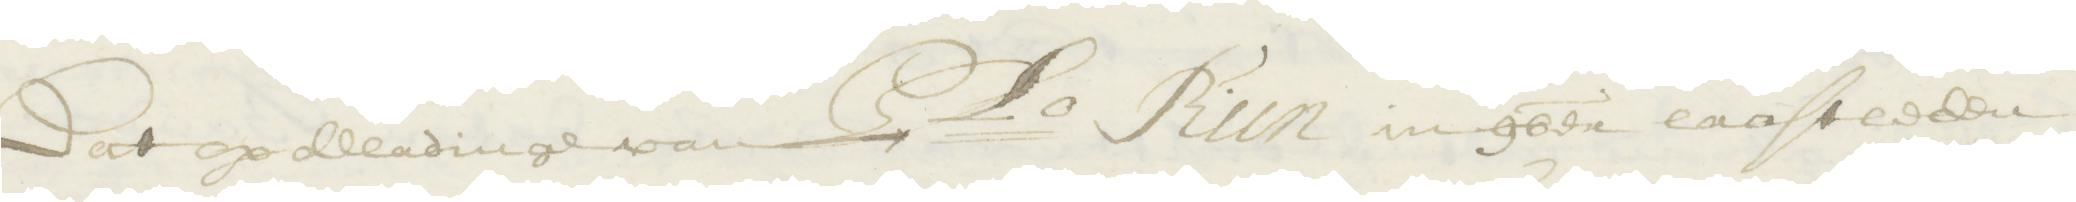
Dat op deladinge van P=lo Run in 9ber er laastleden
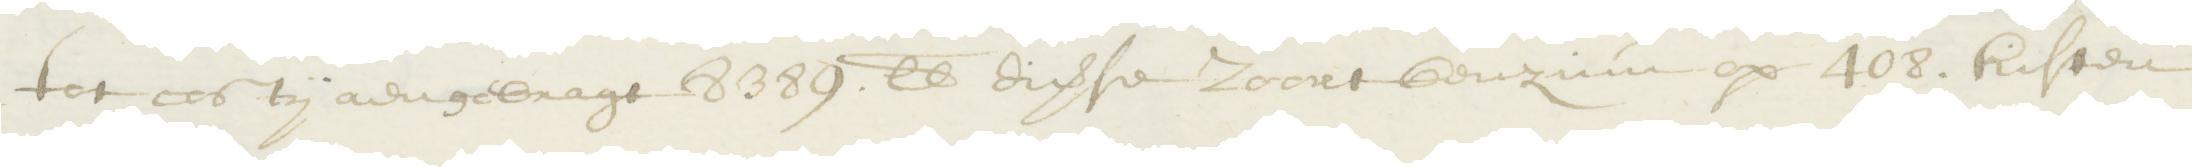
tot costij aengebragt 8389. lb diverse Zoort bezuin op 408. kisten
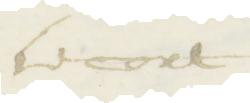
tecort
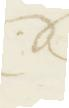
:d.O
